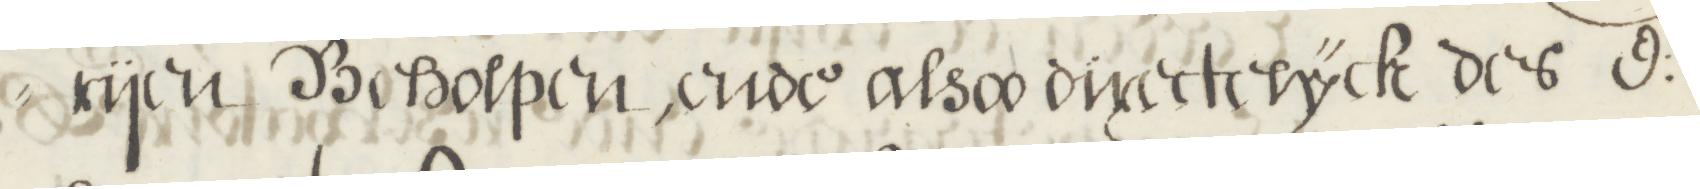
„rijen Beholpen, ende alsoo directelyck des E:
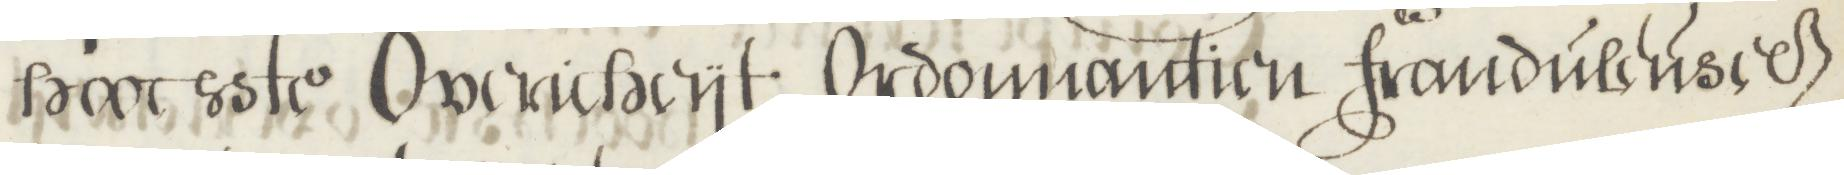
hoochste Overicheijt Ordonnantien franduleuselijk
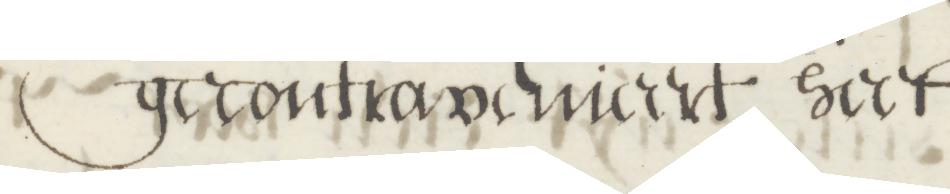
gecontravenieert heeft.
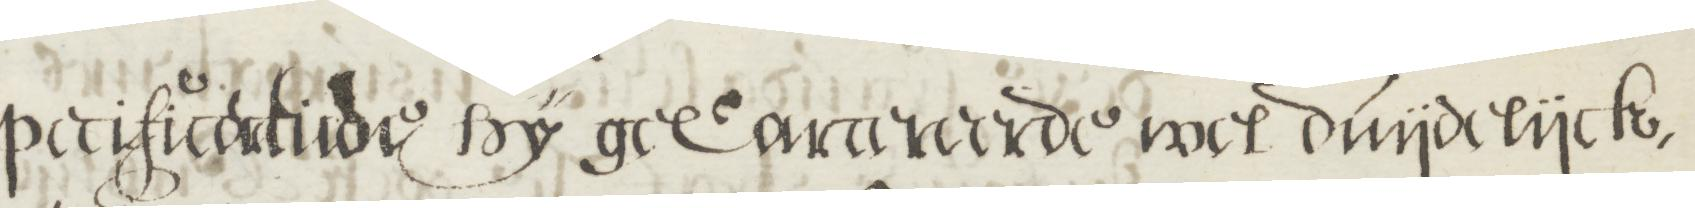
Specificerende hij gecarareerde wel duijdelijck,
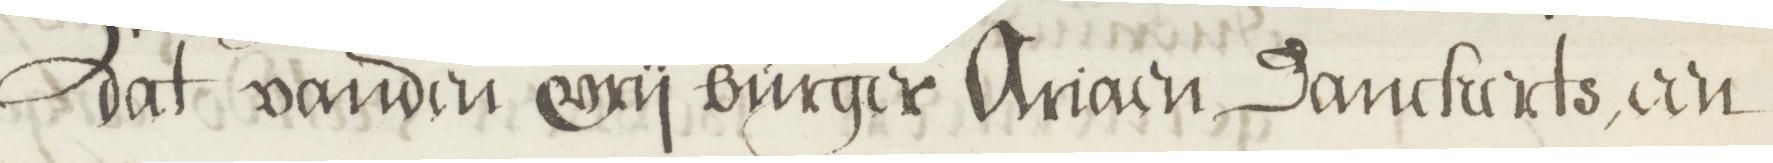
dat vanden vrij burger Ariaen Danckerts, een
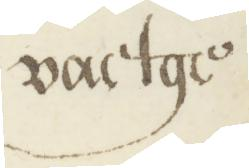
vaetge
